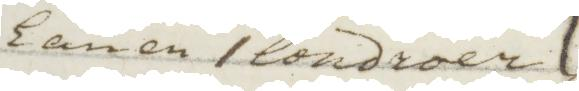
hanen 1 londroer
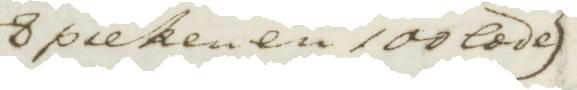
8 pieken en 100 lode
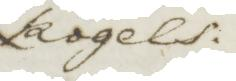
kogels.
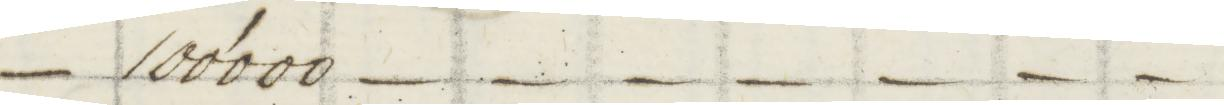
— 100'000 — — — — — — —
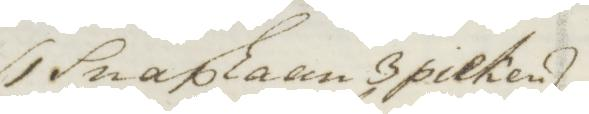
1 snaphaan 3 pieken
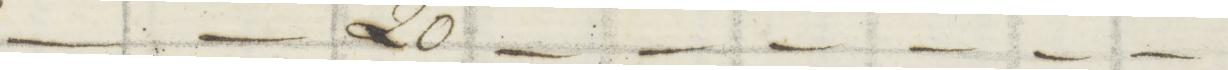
— — 20 — — — — — —
